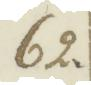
62.
